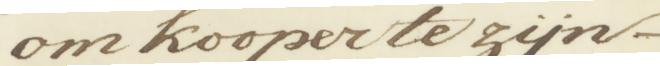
om kooper te zijn-
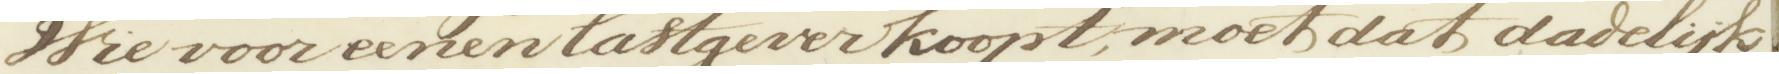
Wie voor eenen lastgever koopt moet dat dadelijk
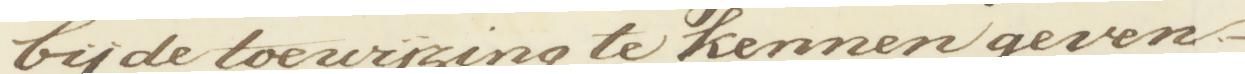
bij de toewijzing te kennen geven.-
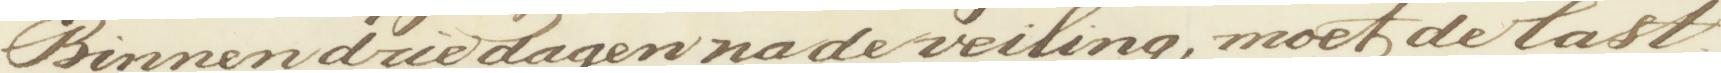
Binnen drie dagen na de veiling, moet de last„
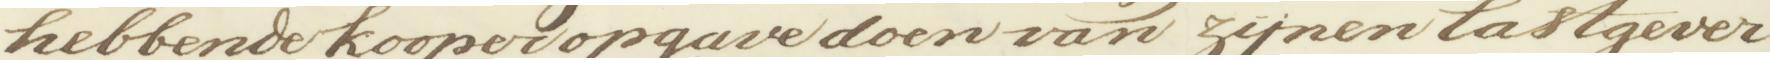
hebbende kooper opgave doen van zijnen lastgever
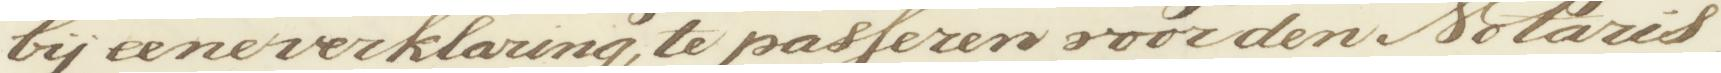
bij eene verklaring, te passeren voor den Notaris,
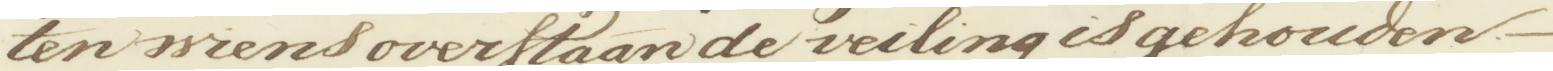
ten wiens overstaan de veiling is gehouden.—
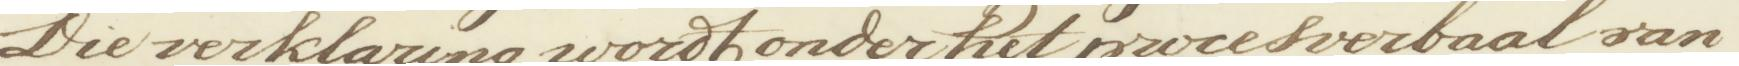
Die verklaring wordt onder het procesverbaal van
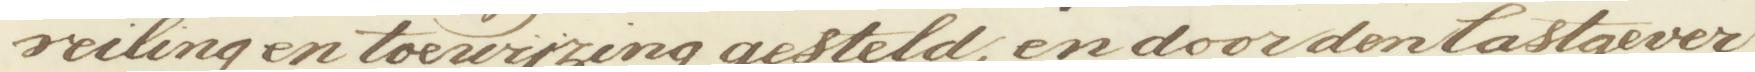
veiling en toewijzing gesteld, en door den lastgever
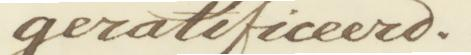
geratificeerd.
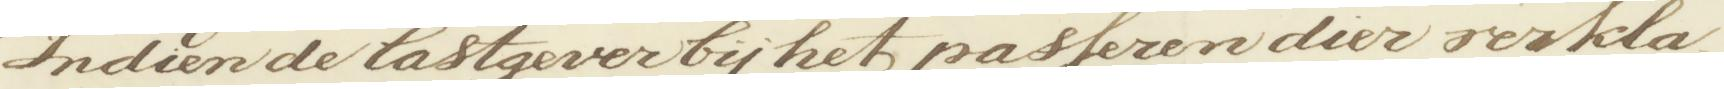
Indien de lastgever bij het passeren dier verkla
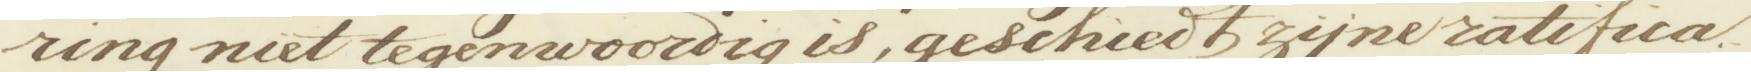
ring niet tegenwoordig is, geschiedt zijne ratifica„
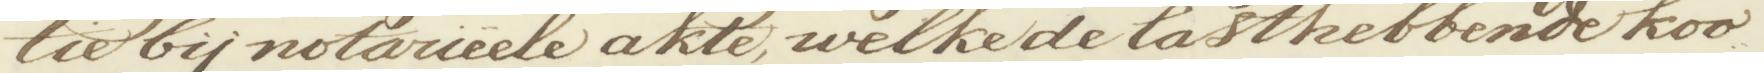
tie bij notarieele akte, welke de lasthebbende koo„
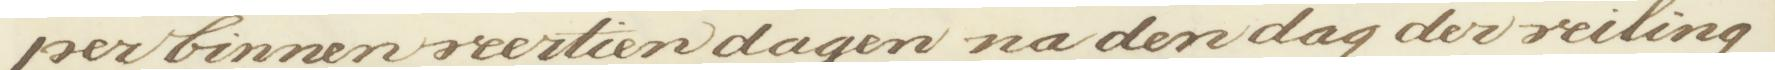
per binnen veertien dagen na den dag der veiling
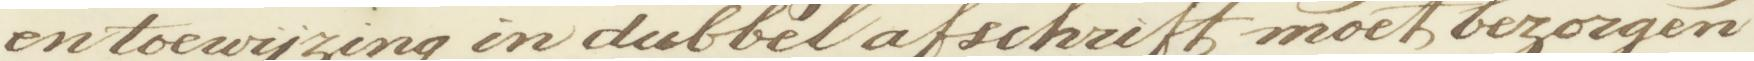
en toewijzing in dubbel afschrift, moet bezorgen
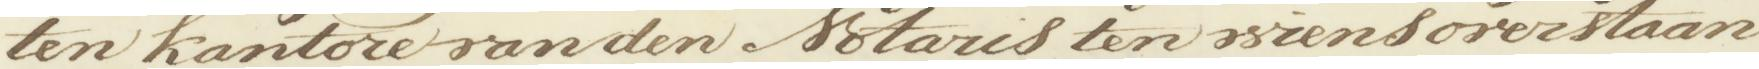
ten kantore van den Notaris ten wiens overstaan
